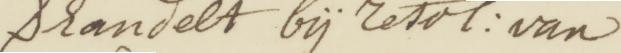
verhandelt bij resol: van
